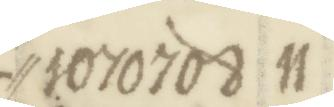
„1070708 11
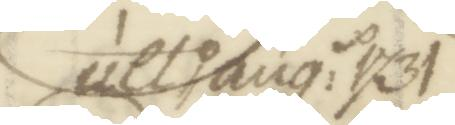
ult„o aug:s 1731
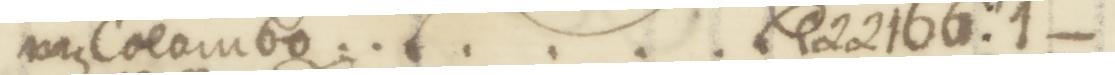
van Colombo . . ƒ. . . . ƒ522166. 1 —
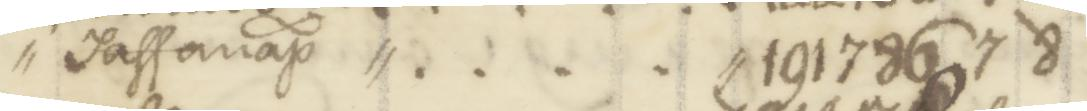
„ Iaffanap „ . . . . „ 191786 7 8
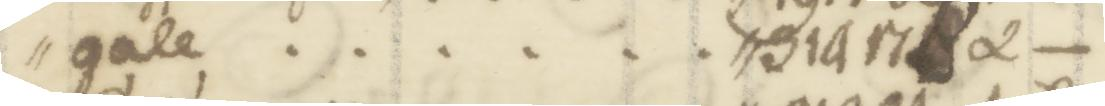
„ gale . . . . . . „ 314178 2 —
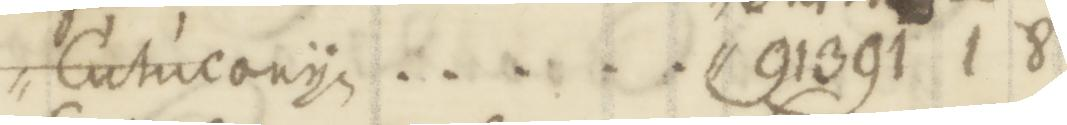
„ tutucorijn . . . . . „ 91391 1 8
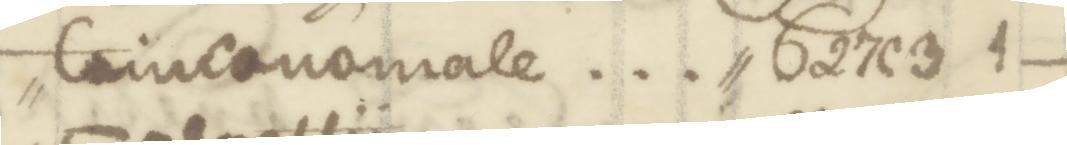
„ trinconomale . . . „ 62753 1 —
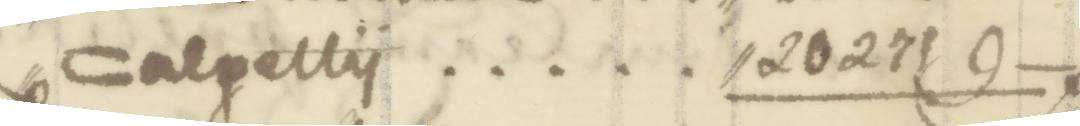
„ calpettij . . . . . „ 2027 9 —
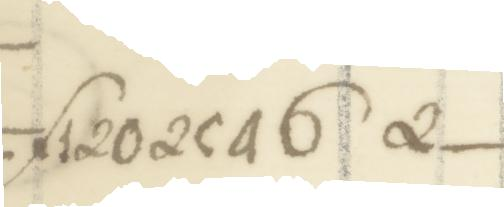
ƒ1202546 2 —
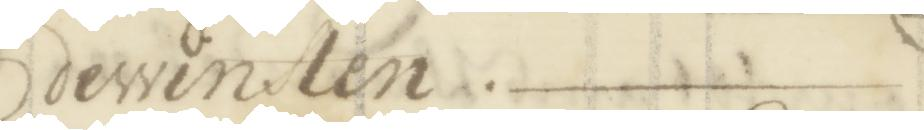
dewinsten. —
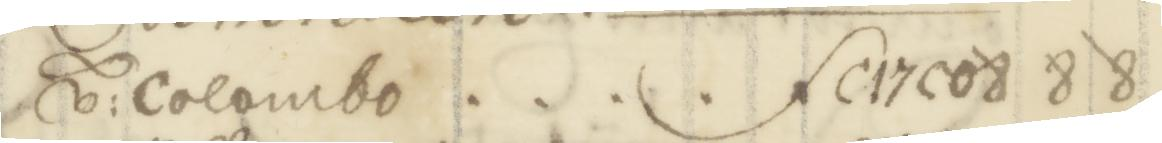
v: colombo . . . . ƒ517508 8 8
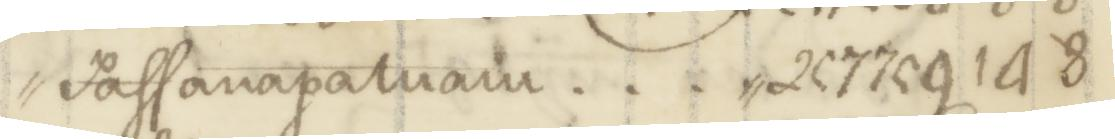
„ Iaffanapatnam . . . „ 257759 14 8
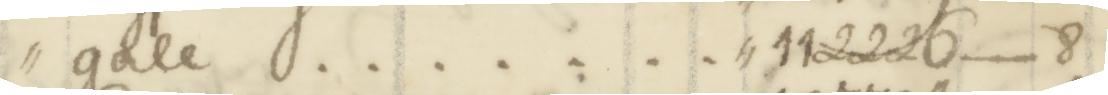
„ gale . . . . . . . „ 112226 — 8
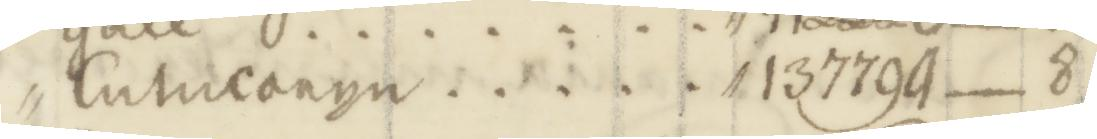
„ tutucorijn . . . . . „ 137794 — 8
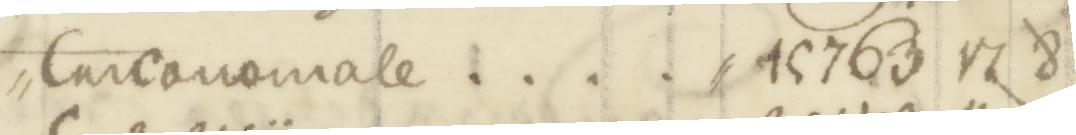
„ triconomale . . . . „ 15763 17 8
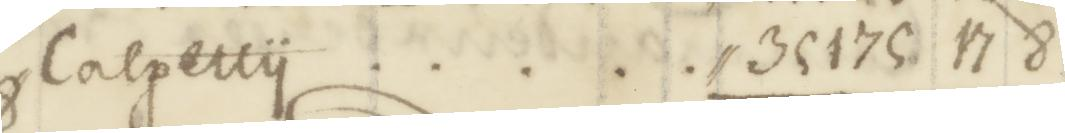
calpettij . . . . . „35175 17 8
